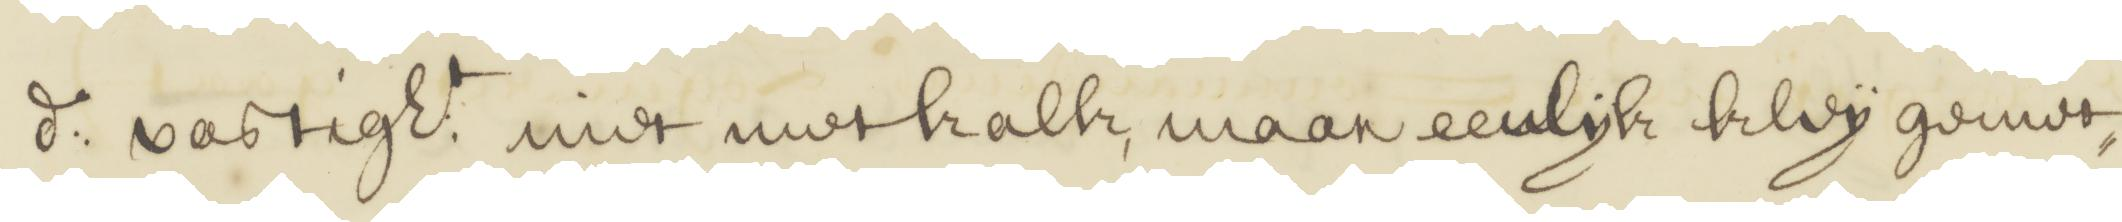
d:o vastigh:t niet met kalk, maar eenlijk kleij gemet„
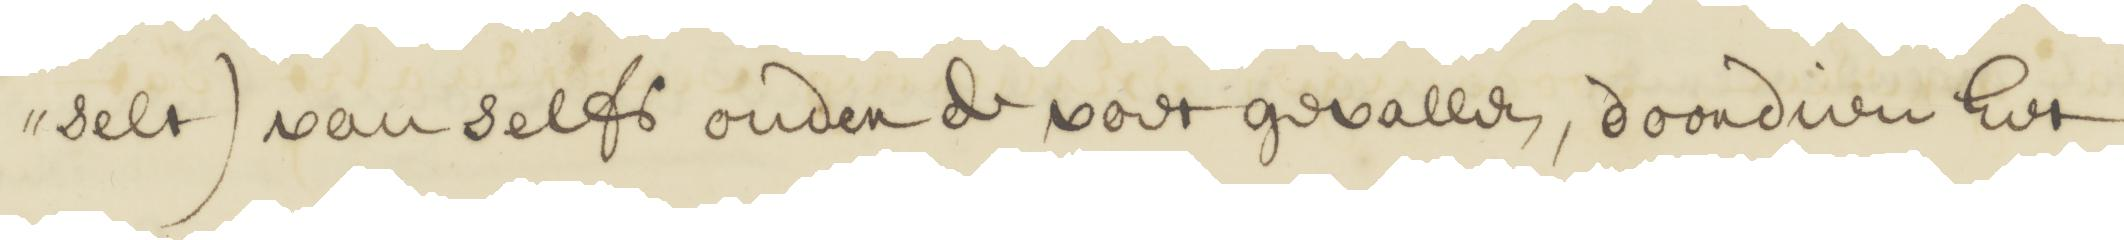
„selt) van selfs onder de voet gevallen, doordien het
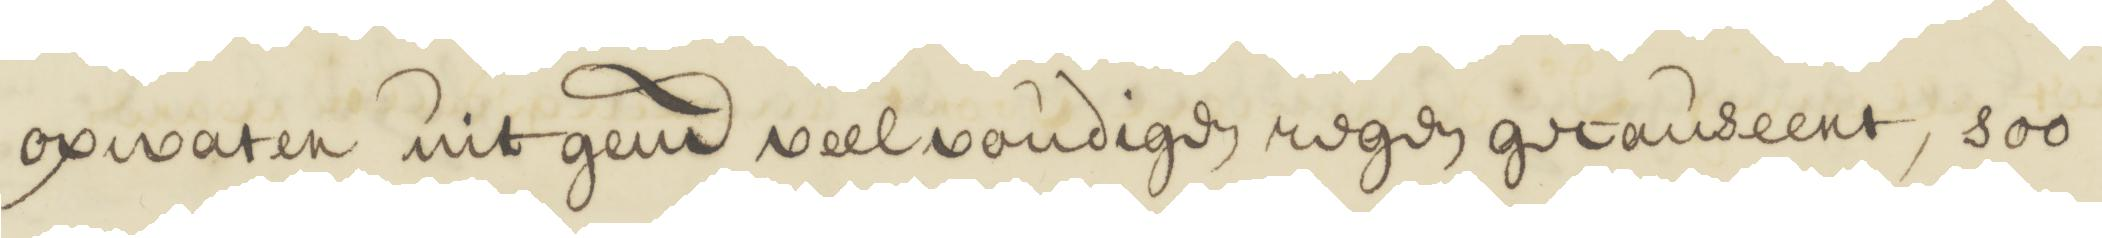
opwater uit gem veel voudigen regen gecauseert, soo
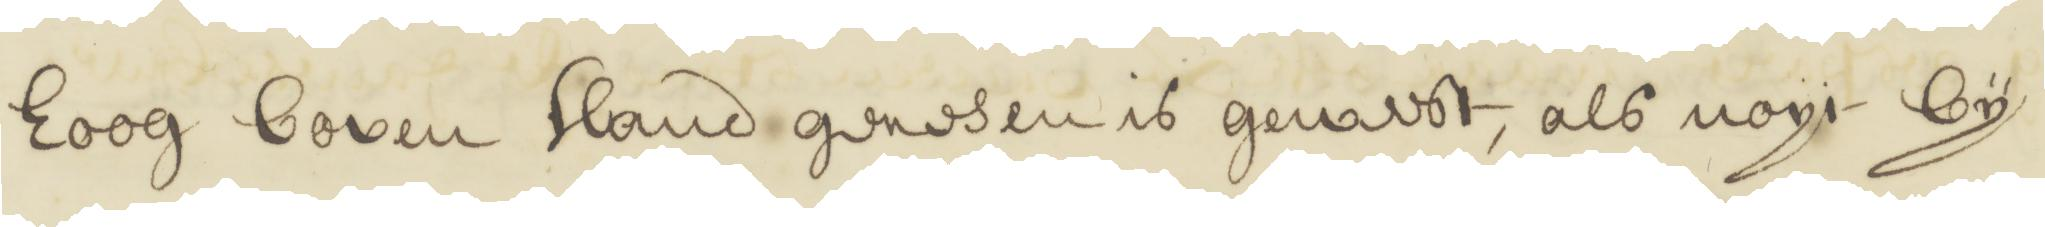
hoog boven tland geresen is geweest, als noijt bij
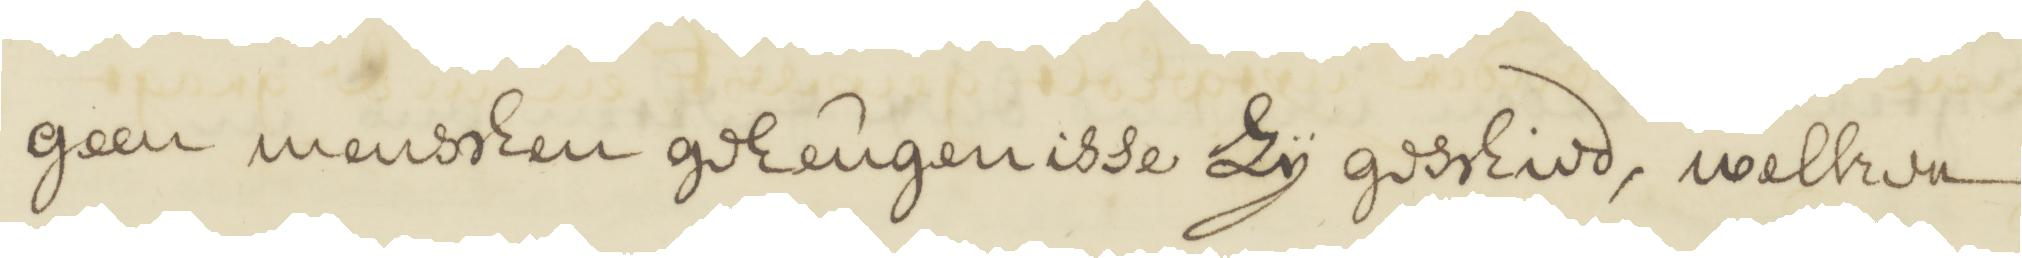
geen menschen geheugenisse zij geschied, welker
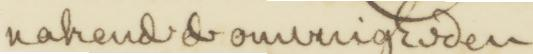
rakende de onenigheden
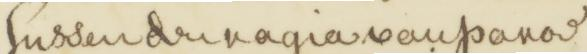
tussen den ragia van paroe
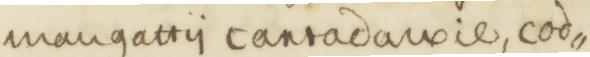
mangattij cartadawil, cod„
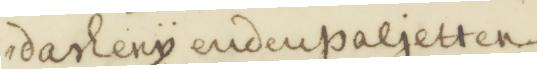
„dacherij enden paljetter
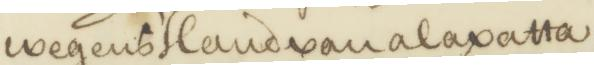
wegens 'tland van alapatta
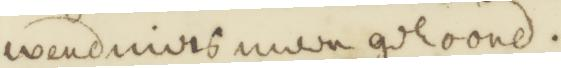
werd niets meer gehoord.
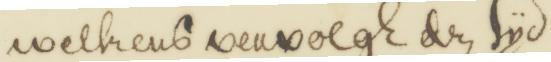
welkens vervolgh den tijd
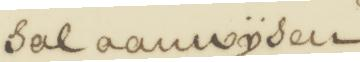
sal aanwijsen
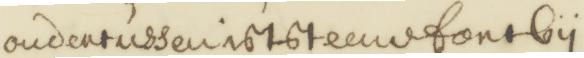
ondertussen is't steene fort bij
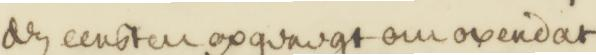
den eersten opgeregt om overdat
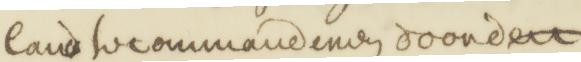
land te commanderen doordat
